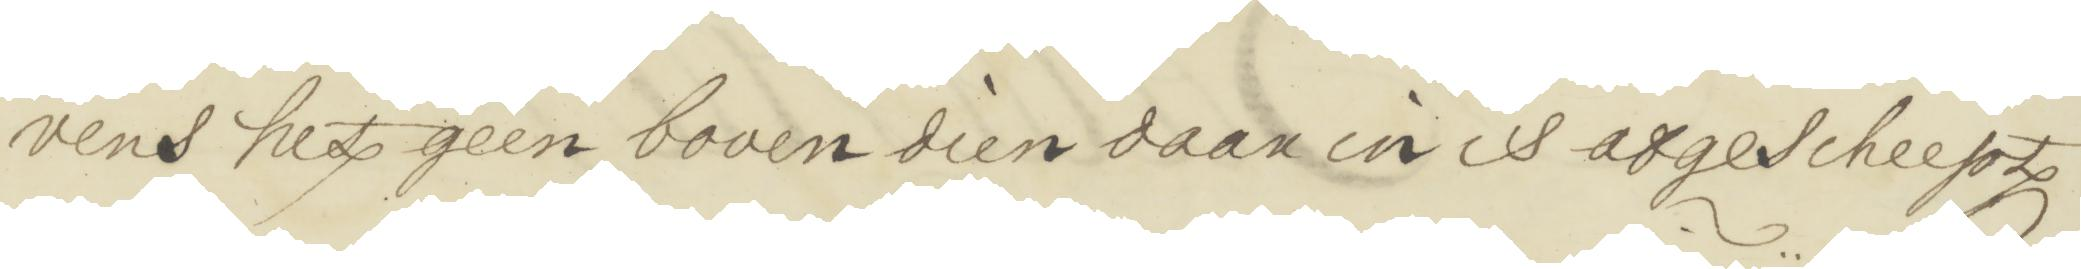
vens het geen boven dien daar in is afgescheept
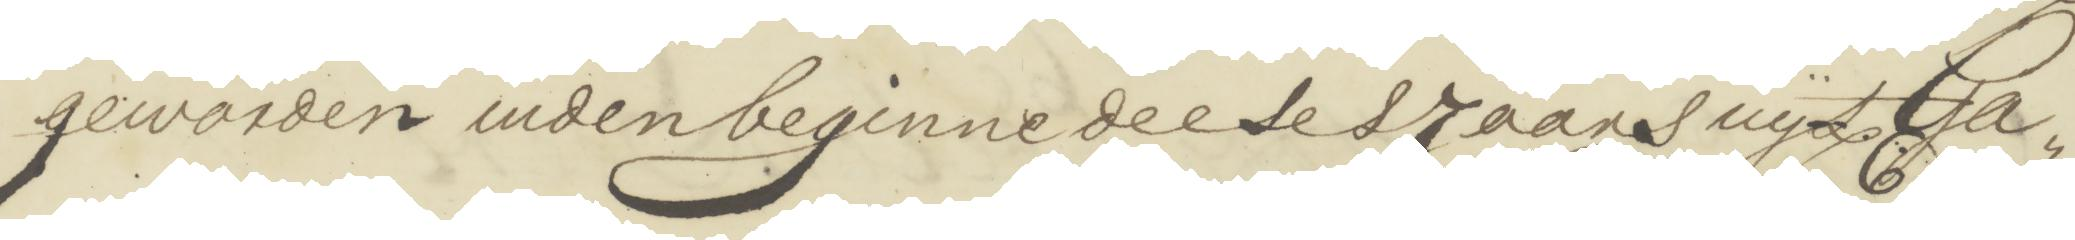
geworden inden beginne deeses Jaars uijt Ga„
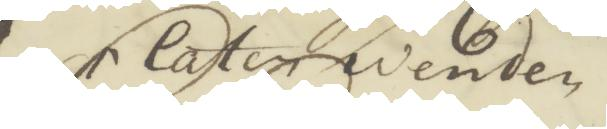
laten wenden
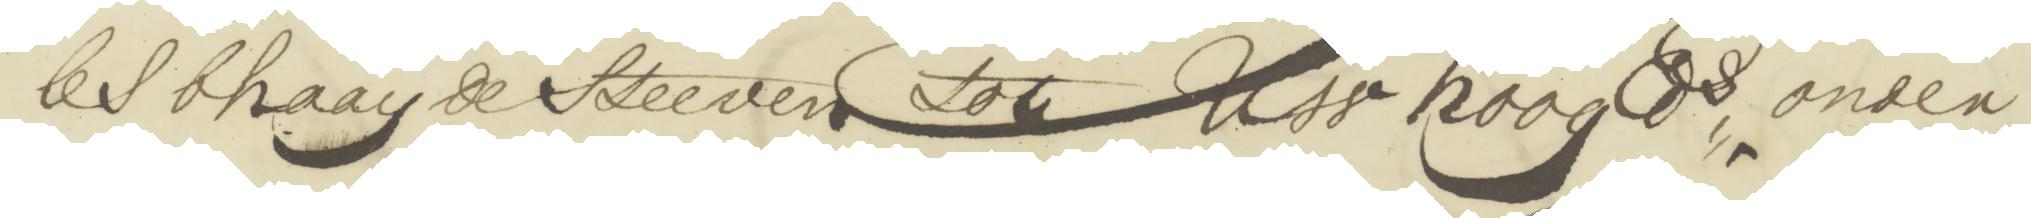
les bhaaij de steeven tot Uw hoog Ed=s onder
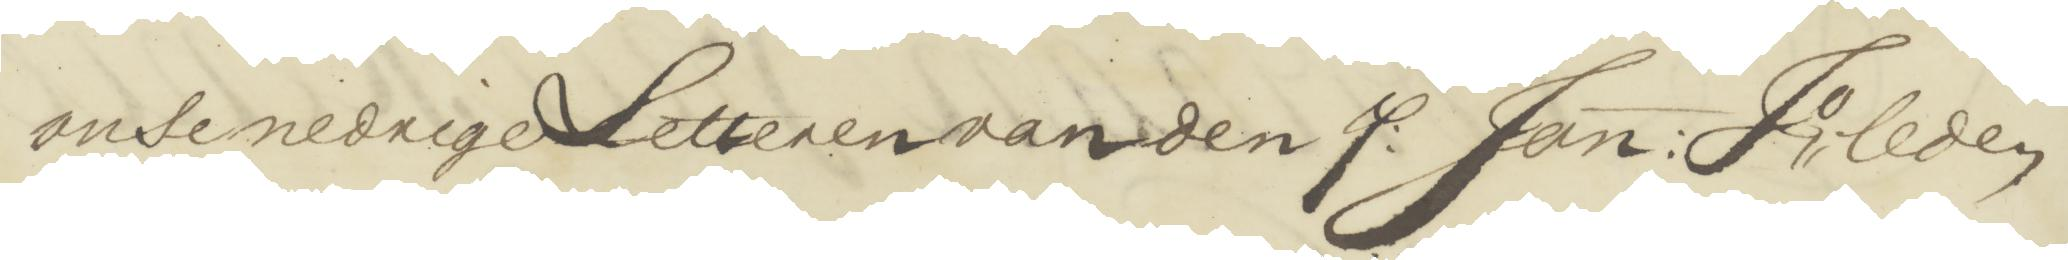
onse nedrige Letteren van den 7: Jan: J„o leden
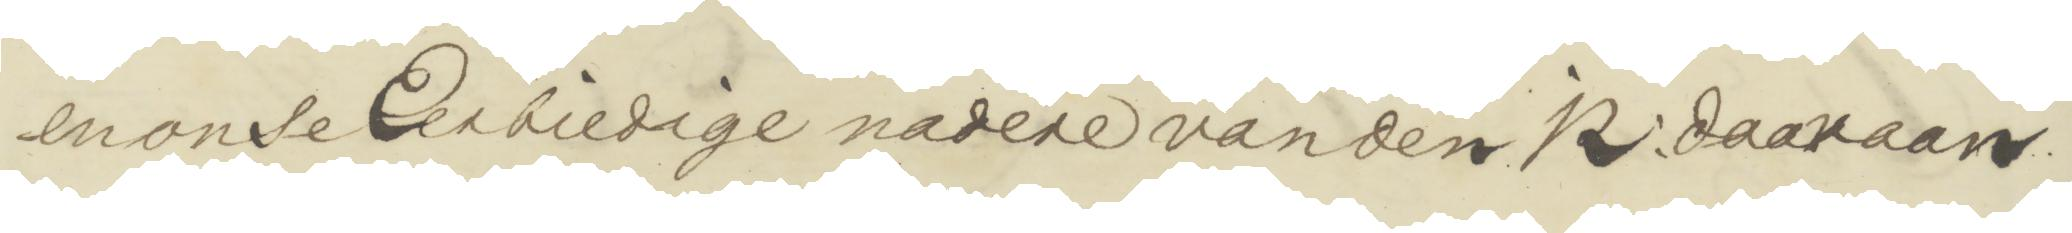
en onse Eerbiedige nadere van den 12: daaraan.
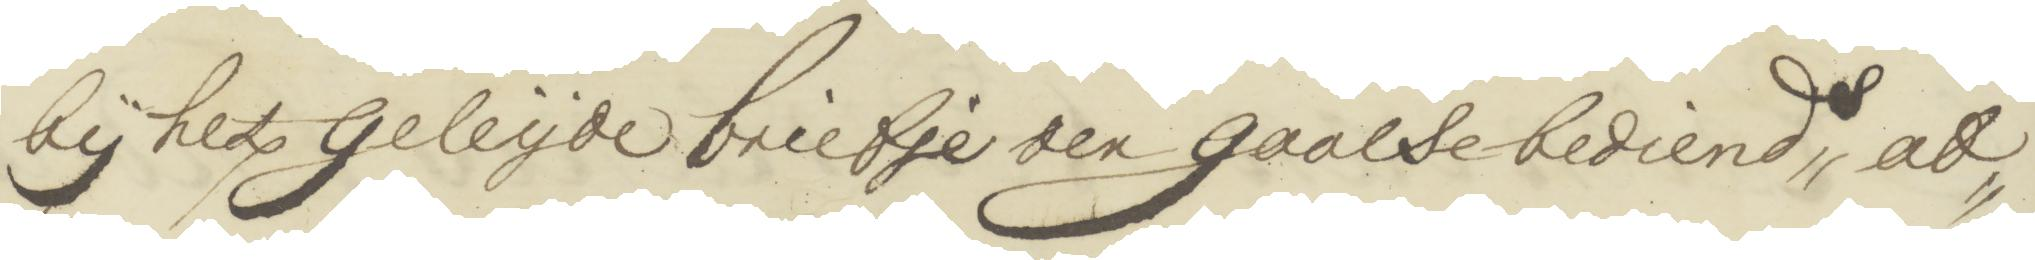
bij het Geleijde briefje der Gaalse bediend„s af„
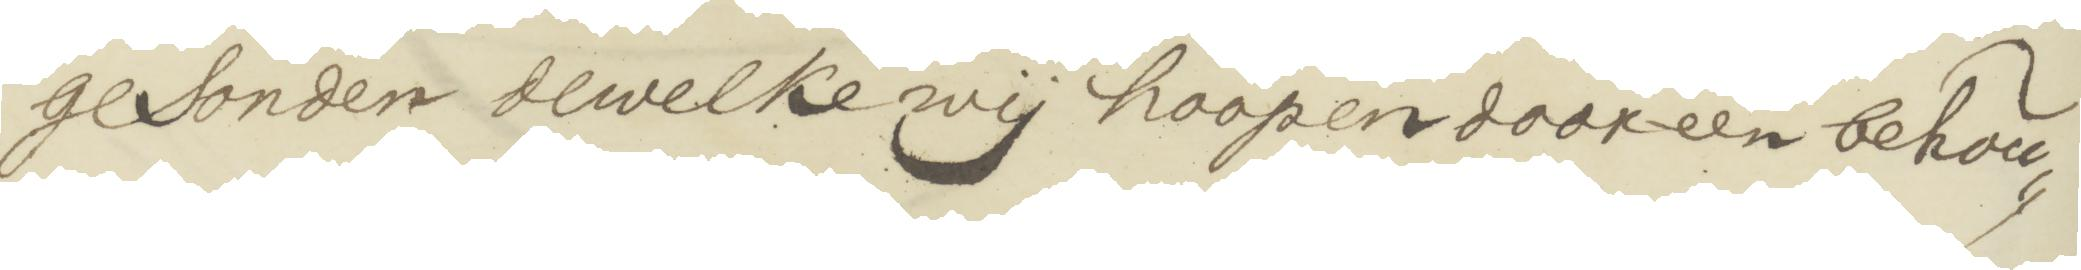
gesonden dewelke wij hoopen door een behou„
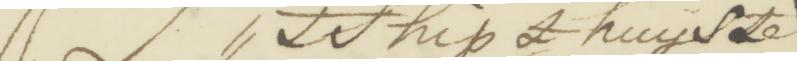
P„r tship t huijs te
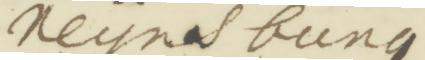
Reijnsburg
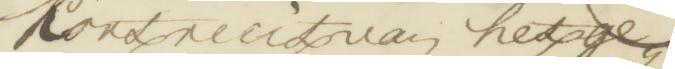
kort recit van het ge„
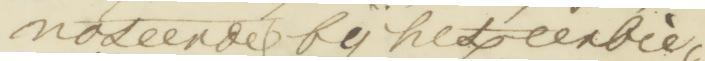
noteerde bij het eerbie„
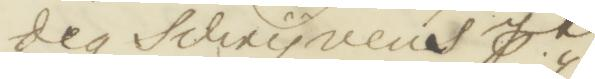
dig schrijvens p„r
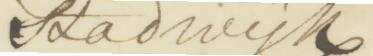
stadwijk
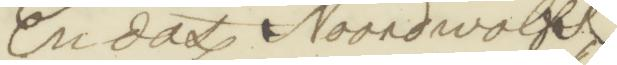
En dat Noordwolfs„
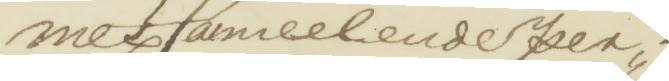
met Cameel ende per„
